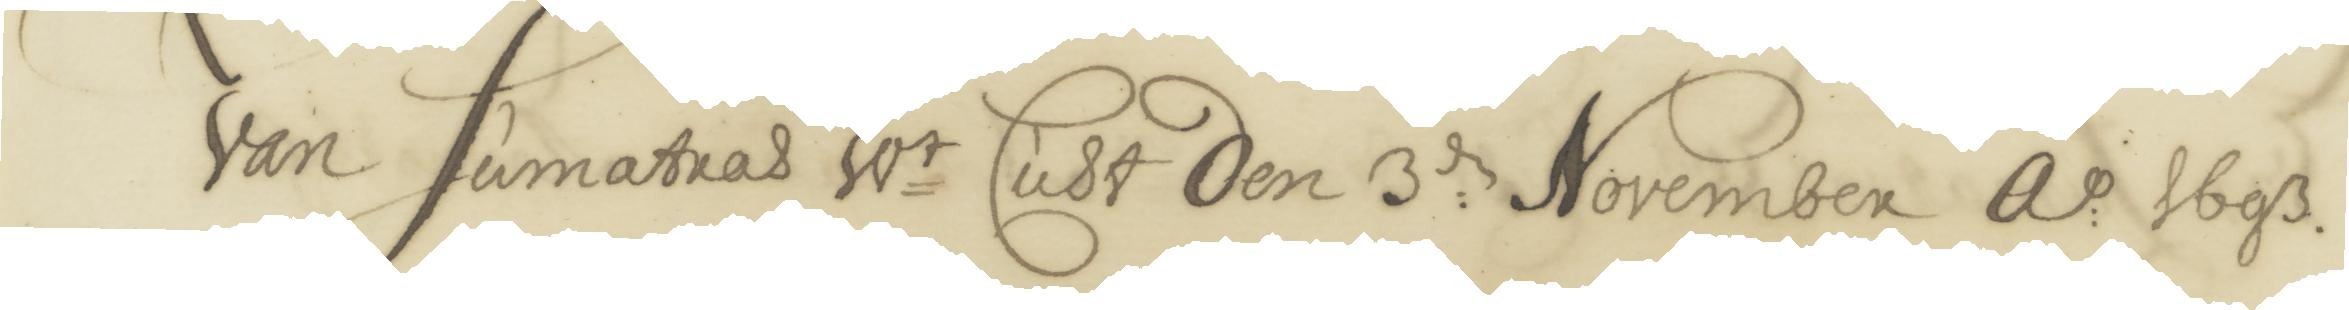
Van Sumatras W=t Cust den 3:en November A:o 1693.
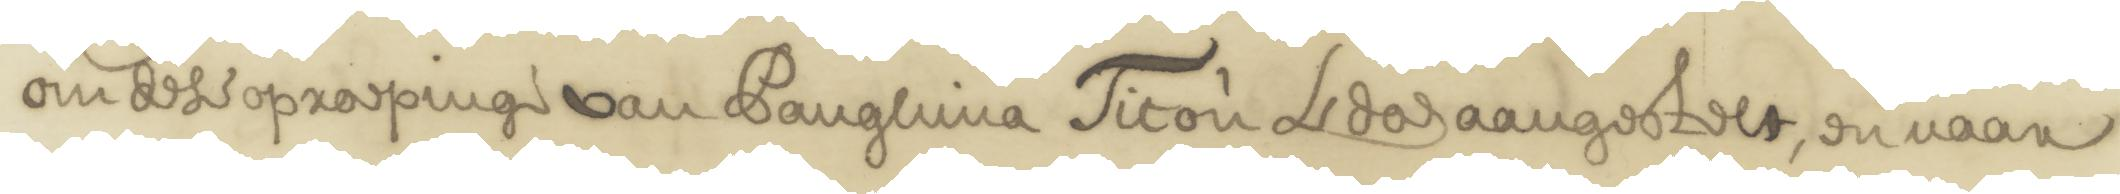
om dese oproepinge van Panglima Ticou te doen aangestelt, en naar
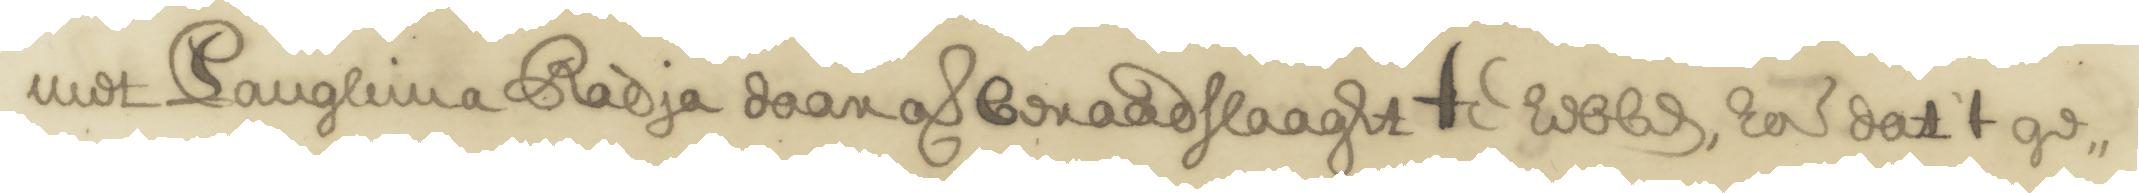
met Panglima Radja daar over beraadslaaght te hebben, hoe dat ’t ge„
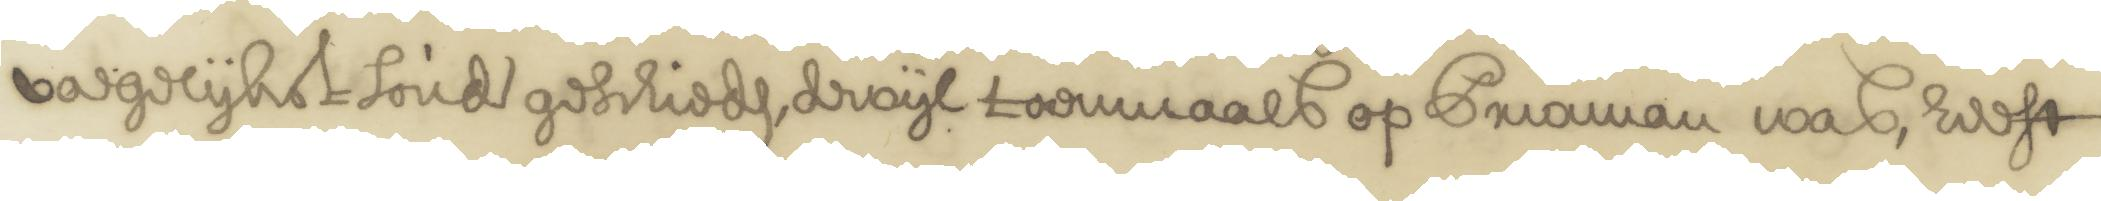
voegelijkst soude geschieden, dewijl toenmaals op Priaman was, heeft
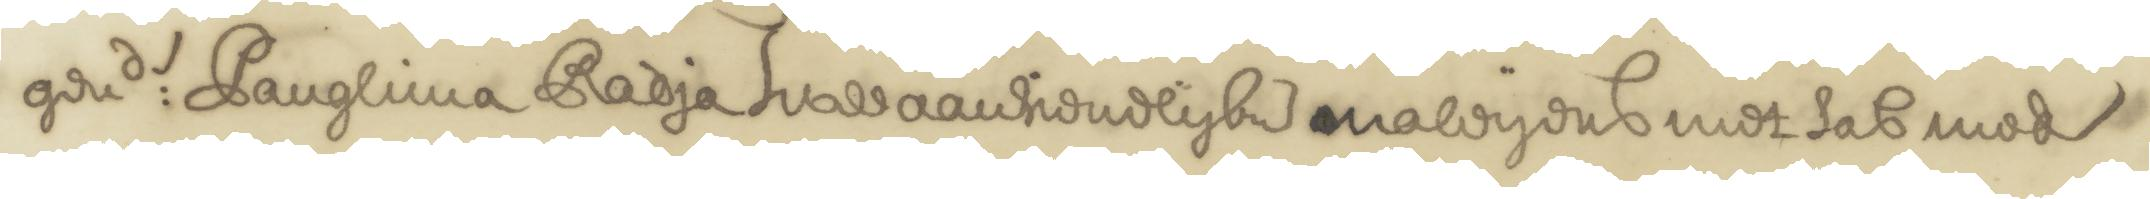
gen:de Panglima Radja twee aansienelijke maleijers niet sas mede
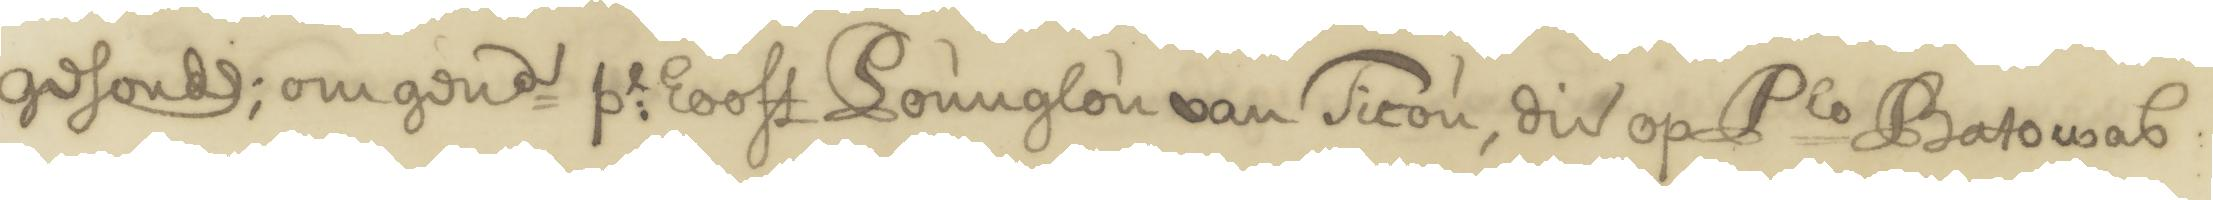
gesonden; om gen=de p:l hooft Pounglou van Ticou, die op P=lo Batowas
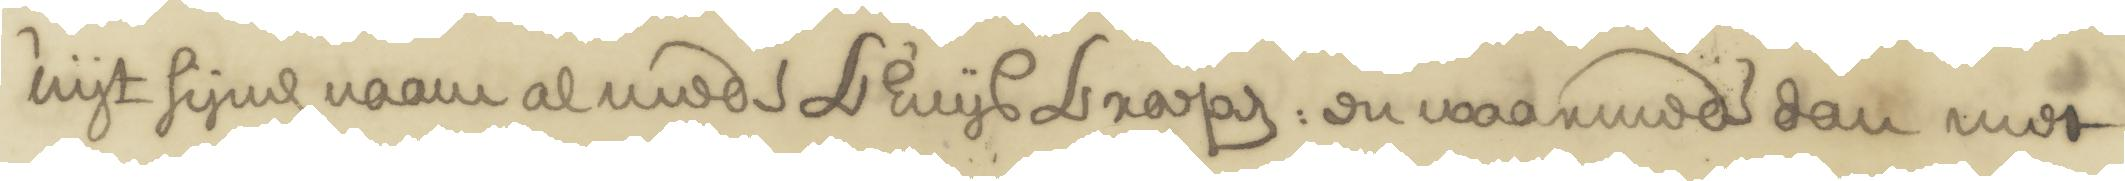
uijt sijnen naam al mede te huijs te roepen: en waarmede dan met
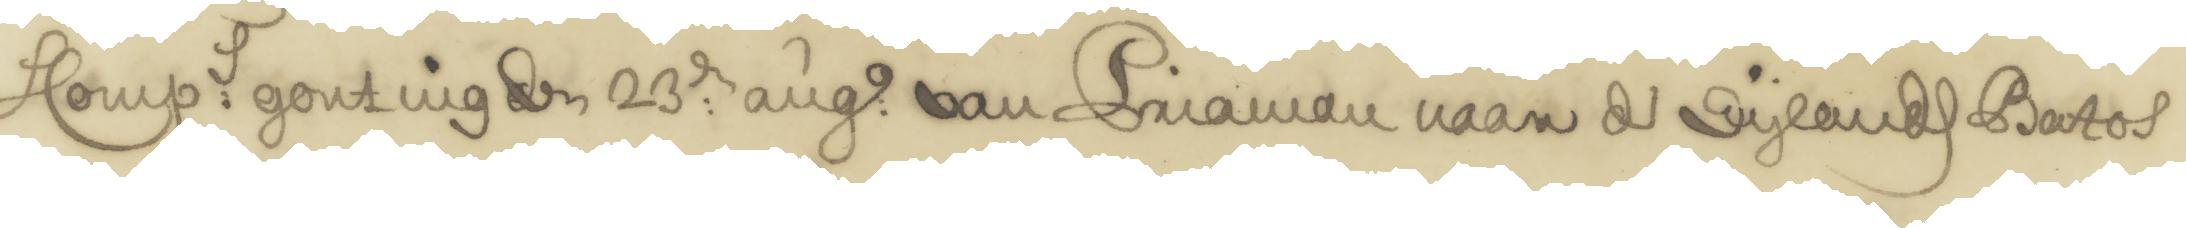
sComp:s gonting den 23:en aug:o van Priaman naar de Eijlanden Batos
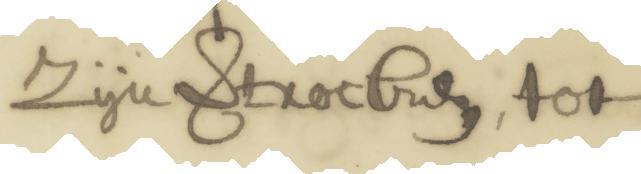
zijn vertrocken, tot
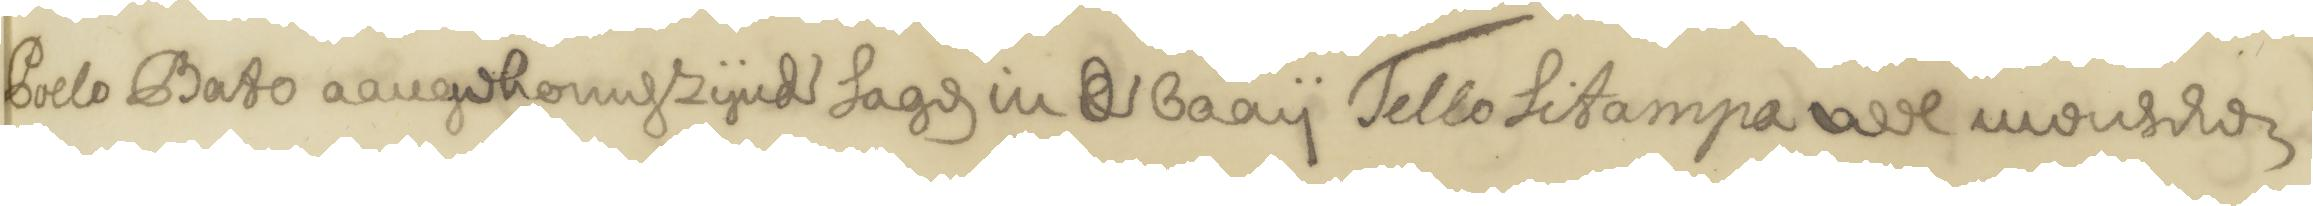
Poelo Bato aangekomen zijnde sagen in de baaij Tello sitampa veel menschen
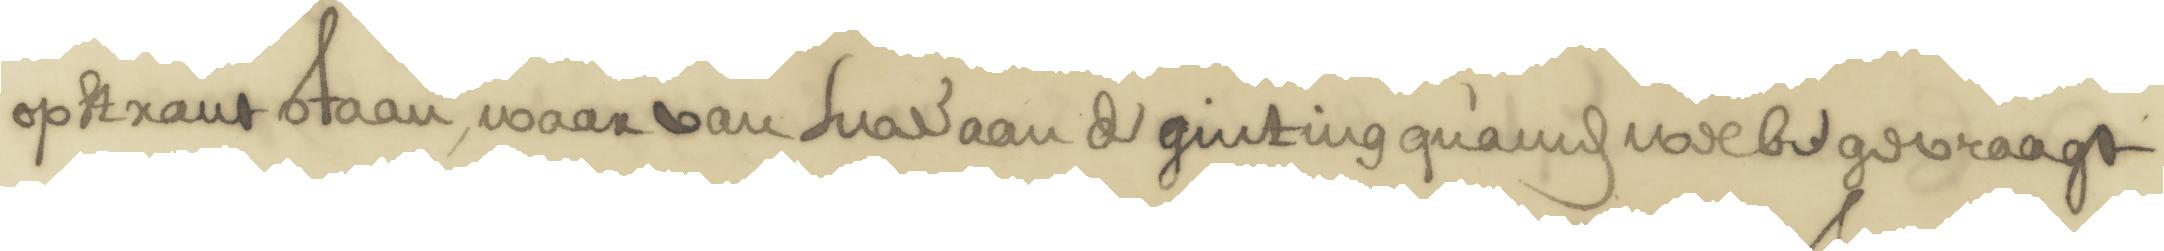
op strant staan, waar van twee aan de ginting quamen welke gevraagt
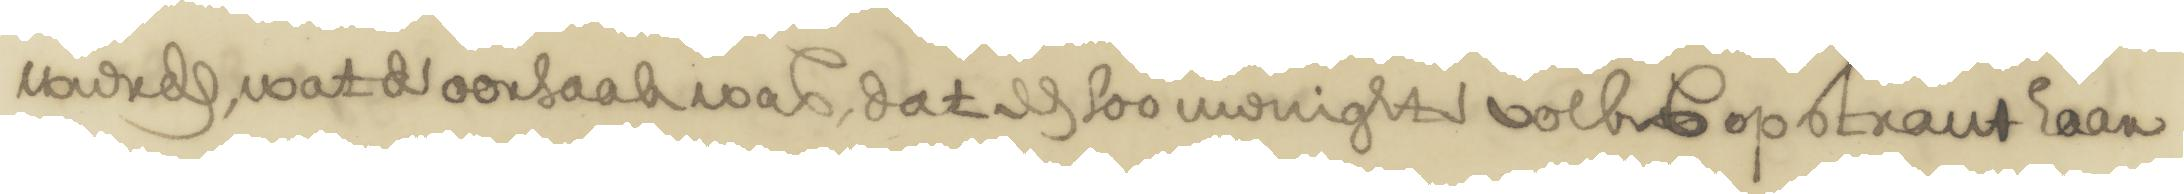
wierden, wat de oorsaak was, dat een soo menighte volks op strant haar
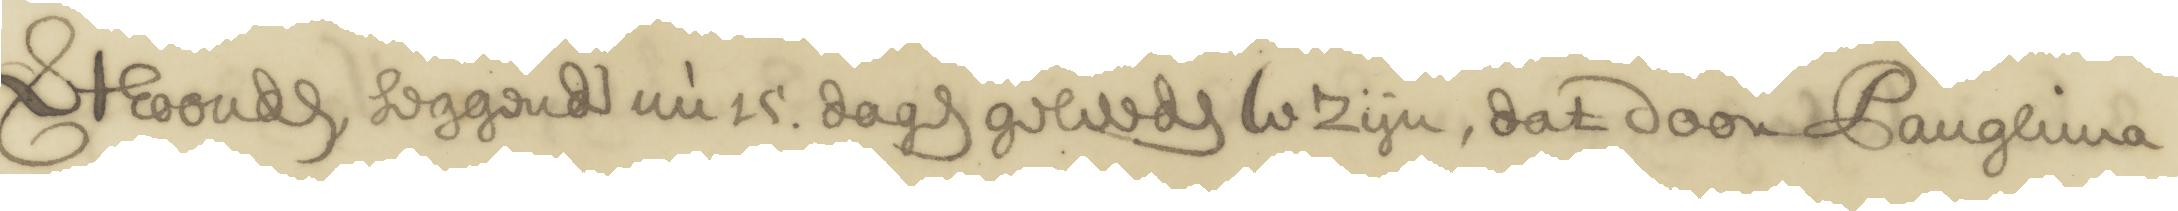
verthoonden, seggende nu 15. dagen geleeden te zijn, dat door Panglima
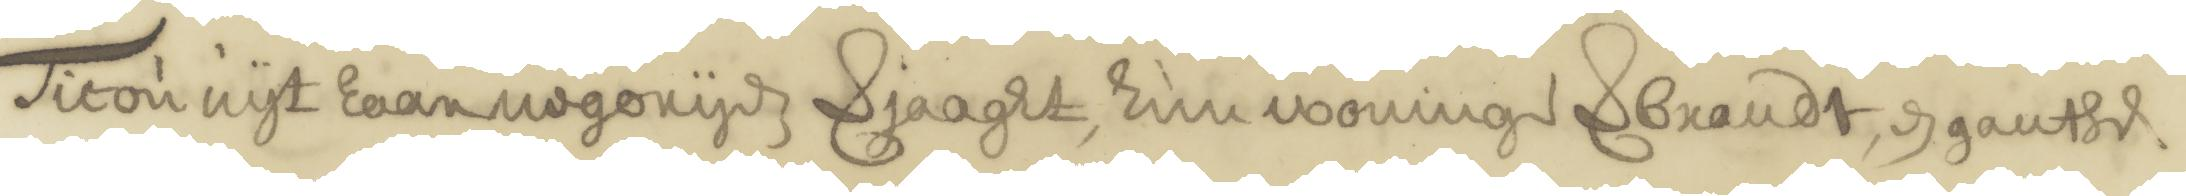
Ticou uijt haar negorijen verjaaght, hun woninge verbrandt, en gantsen
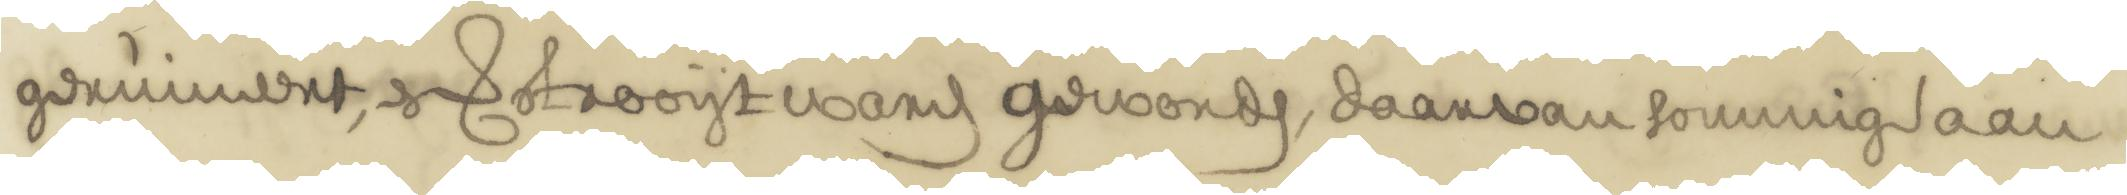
geruineert, en verstrooijt waren geworden, daarvan sommige aan
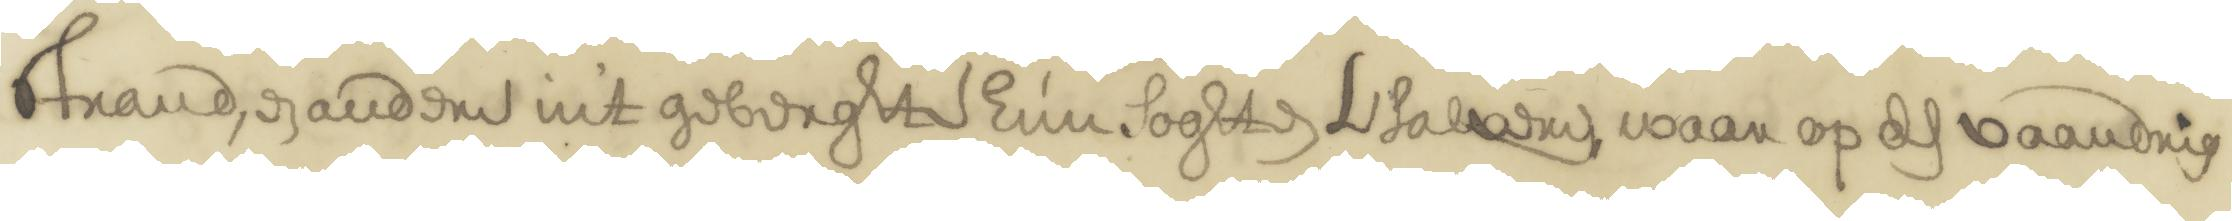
strand, en andere in’t geberghte hun soghten te salveren, waar op den vaandrig
